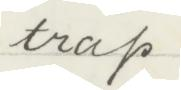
trap
